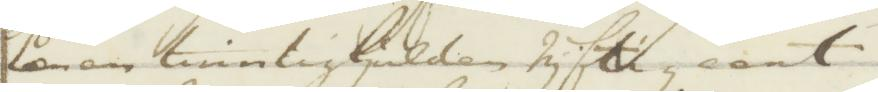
Een en twintig Gulden Vijftig cent
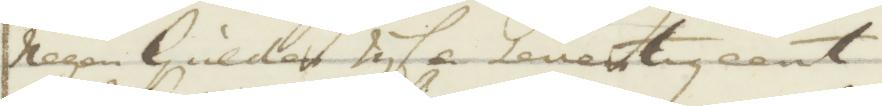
negen Gulden vyf en Zeventig cent
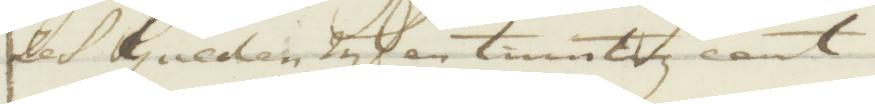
zes Gulden vyf en twintig cent
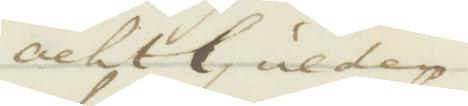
acht Gulden
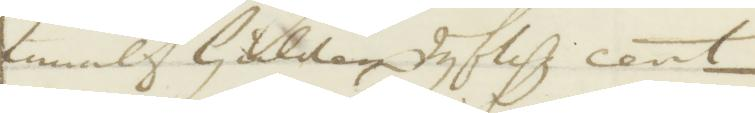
twaalf Gulden vyftig cent
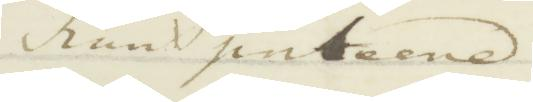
transporteere
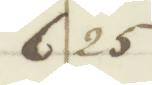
625
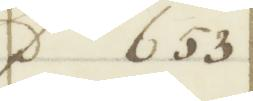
ƒ 653
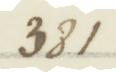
381
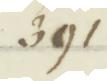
391
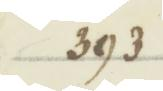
393
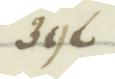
396
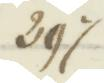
397
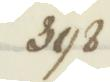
398
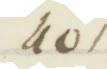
401
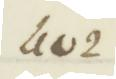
402
